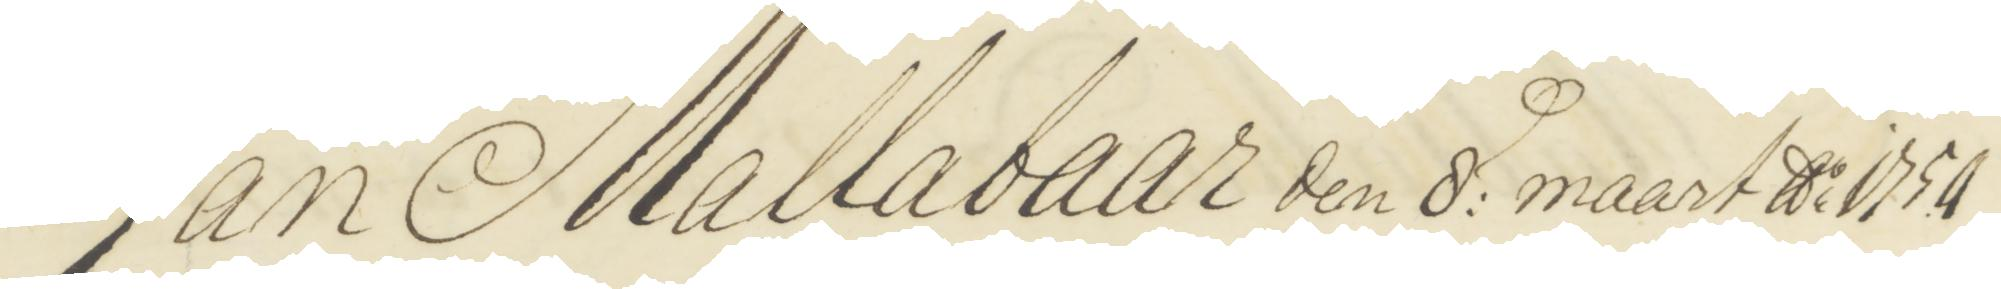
Van Mallabaar den 8:' maart A:o 1754
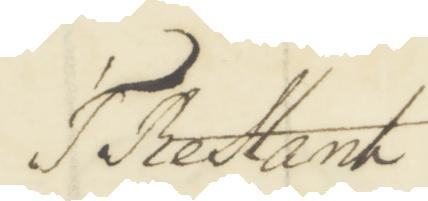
'T Restant
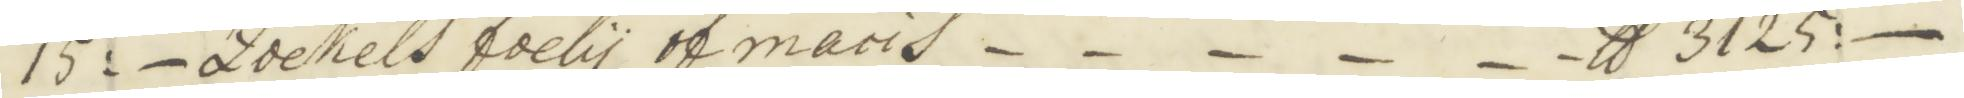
15: — zoekels foelij of macis - - - - - - lb 3125: —
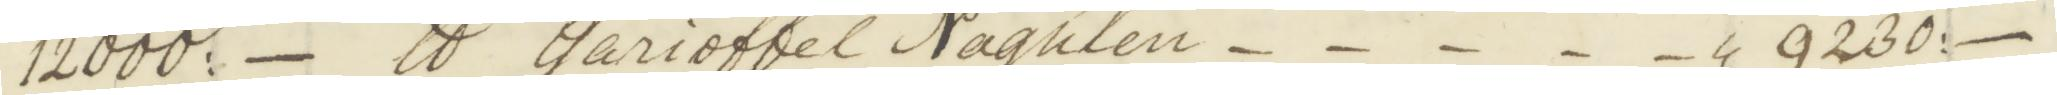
12000: — lb garioffel Nagulen - - - - - „ 9230: —
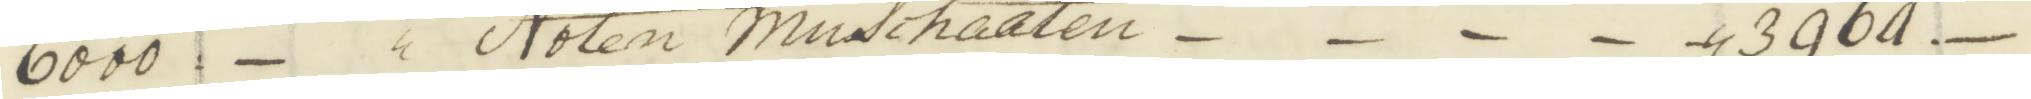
6000: — „ Noten muschaaten - - - - - „ 3964. —
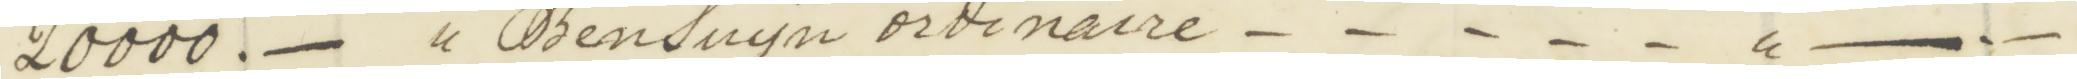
20000. — „ Bensuijn ordinaire - - - - - „ —. —
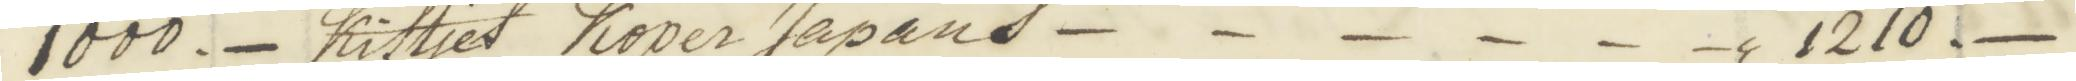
1000. — kistjes koper Japans - - - - - - „ 1210. —
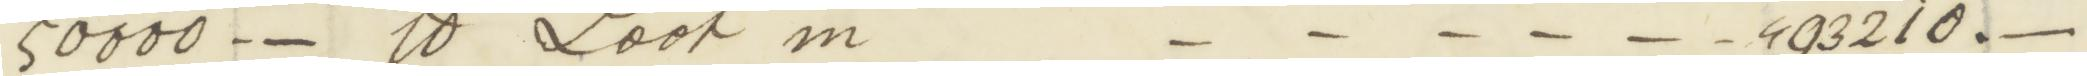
50000. — lb Loot in - - - - - - „ 93210. —
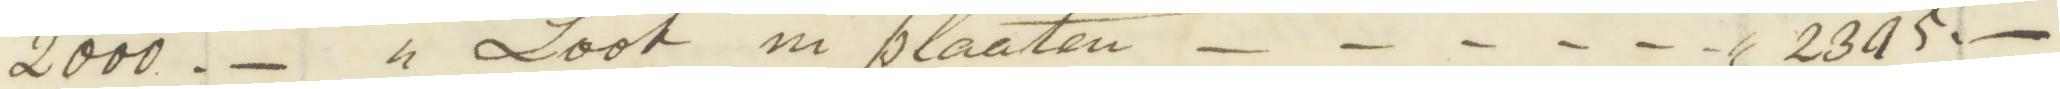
2000. — „ Loot in plaaten - - - - - - „ 2345. —
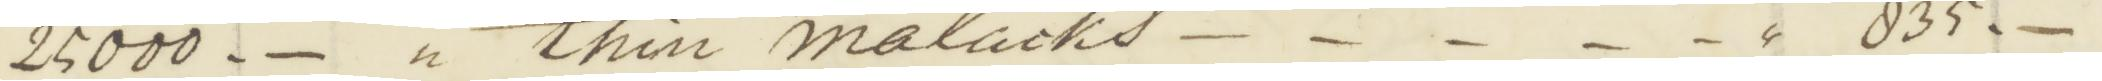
25000. — „ thin malacks - - - - - „ 835. —
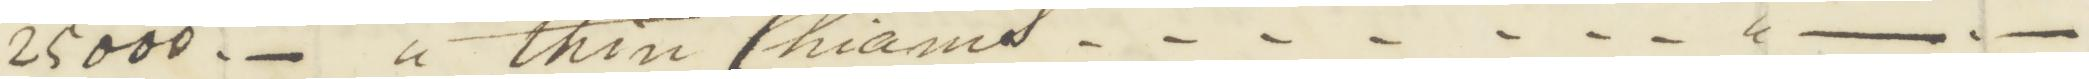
25000. — „ thin Chiams - - - - - - - „ —. —
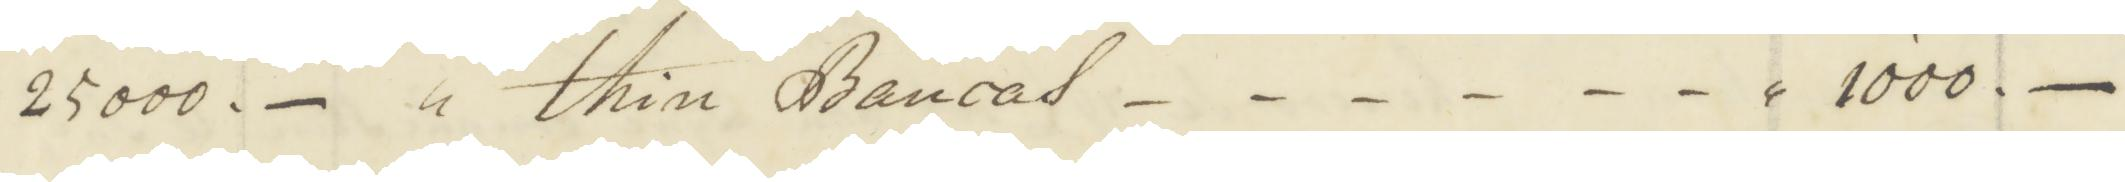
25000. — „ thin Bancas - - - - - - „ 1000. —
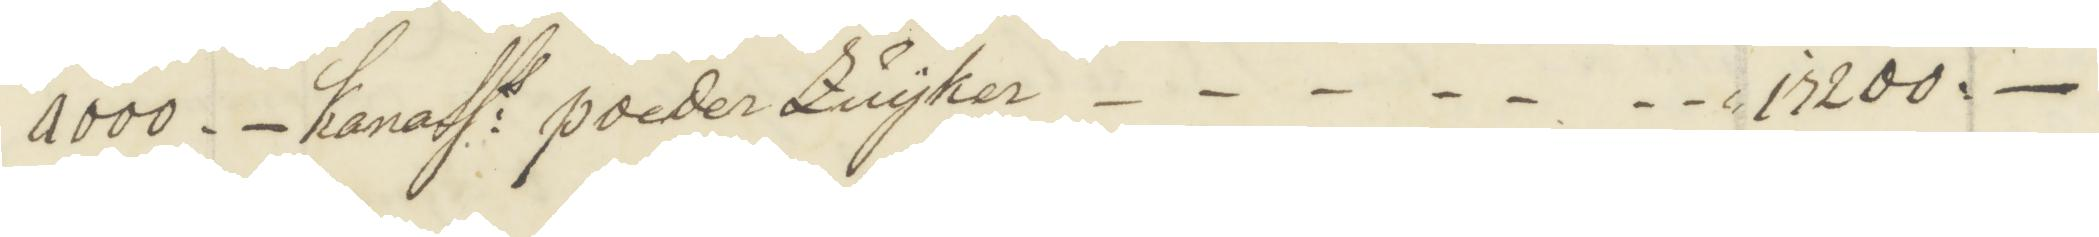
4000. — kanass:s poeder zuijker - - - - - - - „ 17200: —
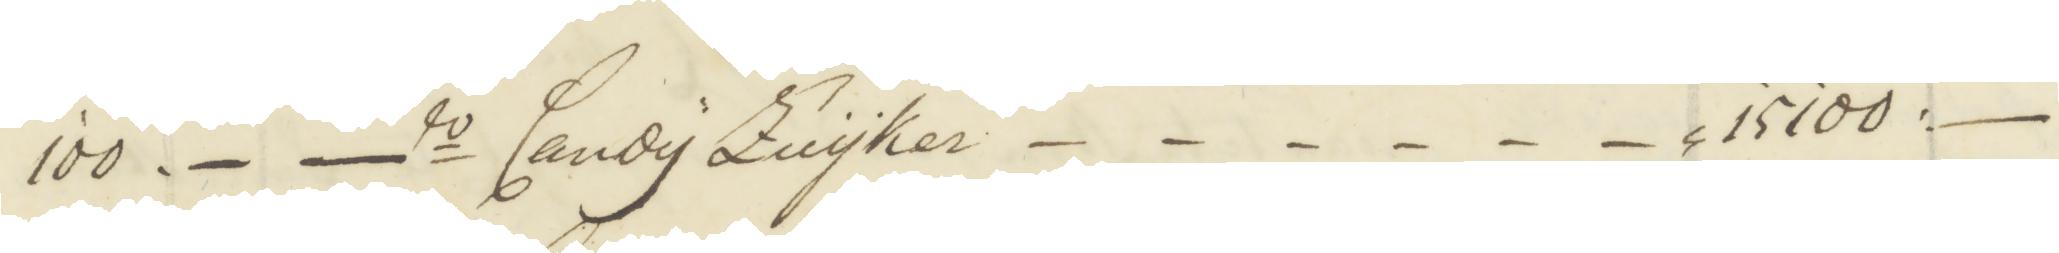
100. — — d=o Candij zuijker - - - - - - „ 15100: —
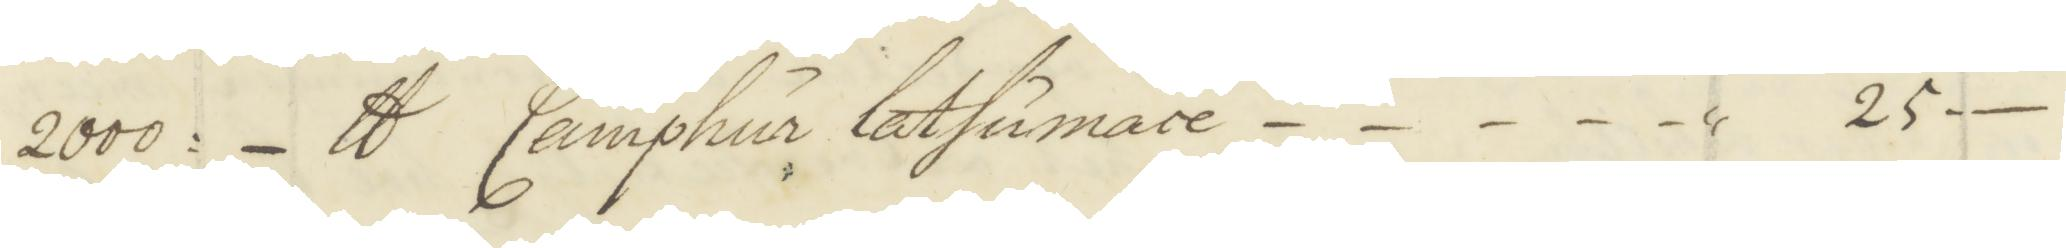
2000: — lb Camphur latsumace - - - - - „ 25. —
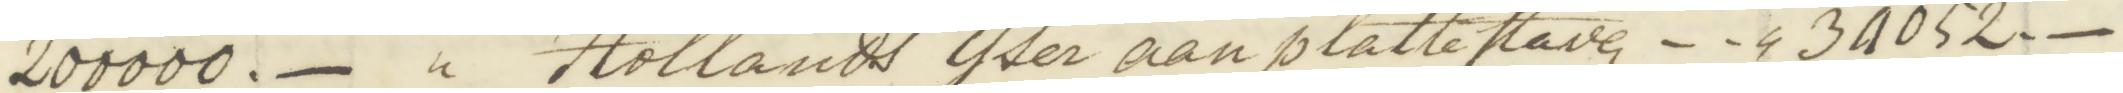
200000. — „ Hollands ijser aan platte staven - - „ 34052. —
